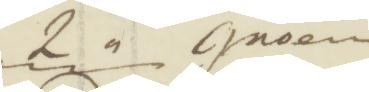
2 „ Groen
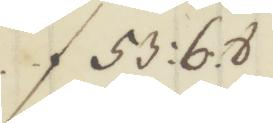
- ƒ 53:6:8
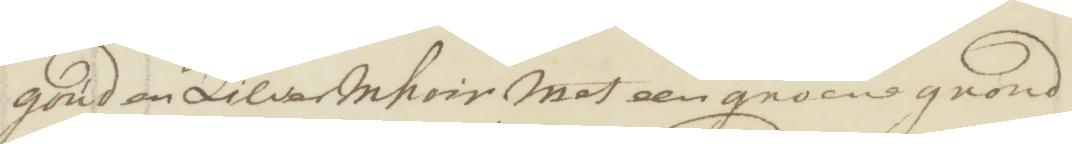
goud en zilver mhoir met een groene grond
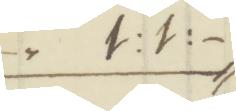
„ 1:1: –
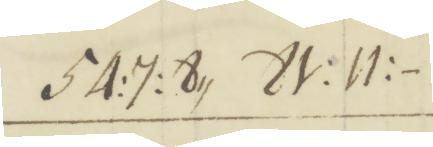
54:7:8„ 81:11:–
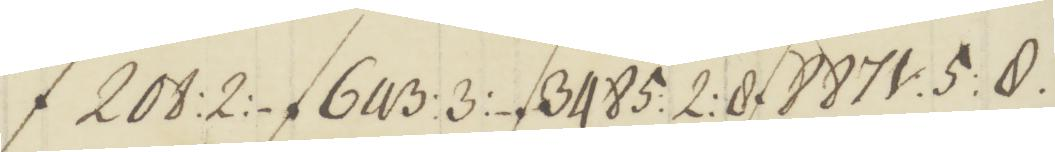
ƒ 208:2:– ƒ643:3:–ƒ3485:2:8ƒ8871:5:8.
